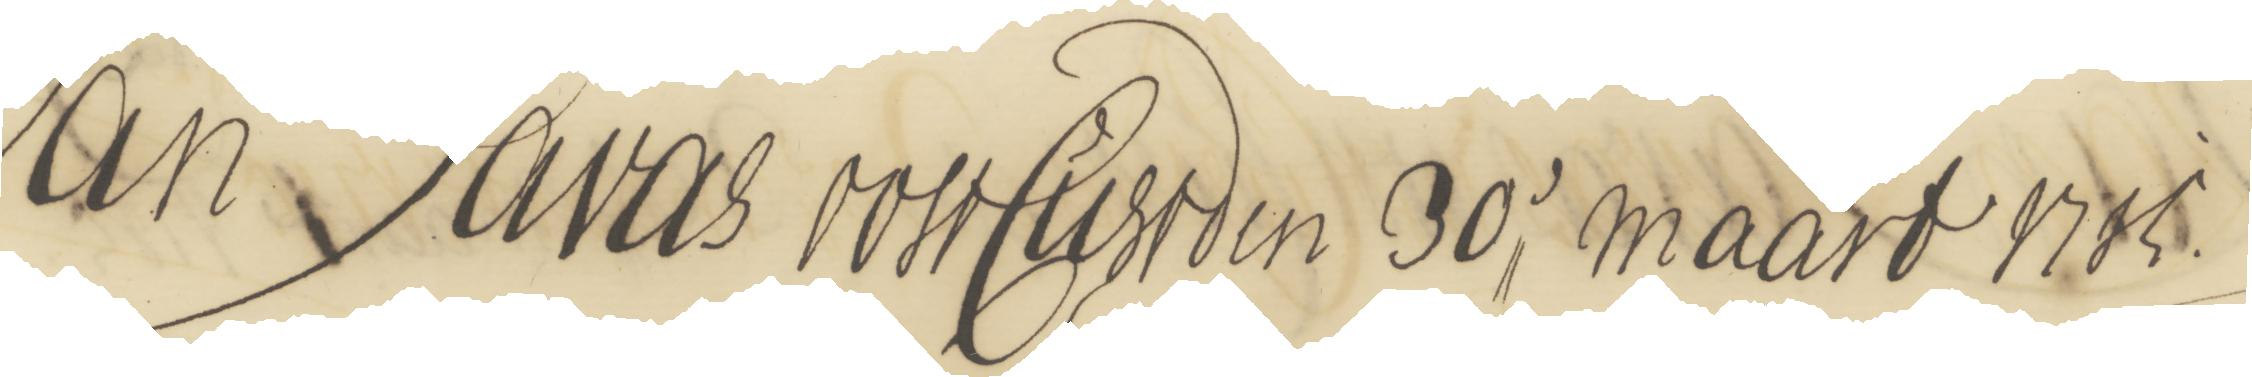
Van Javas oost Cust den 30„' maart 1715.
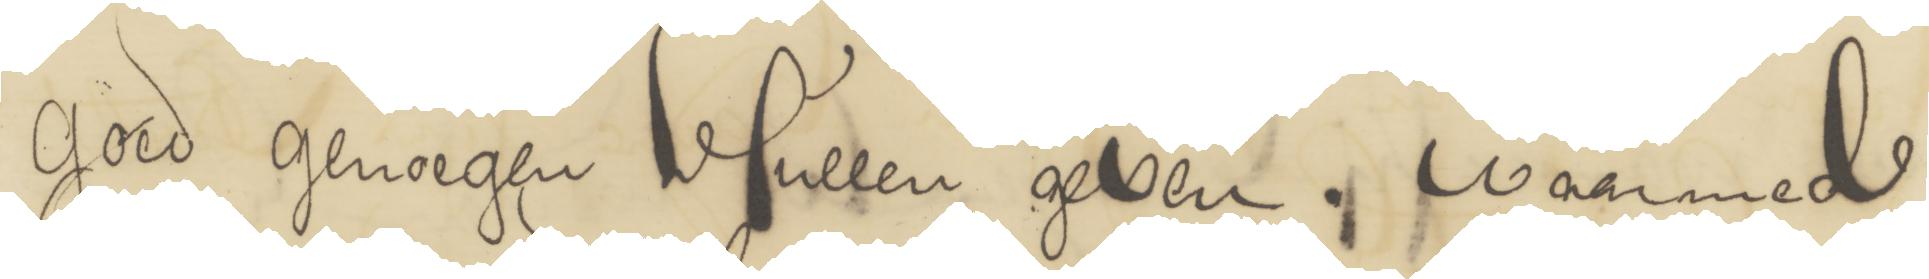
goed genoegen tesullen geven waarmede
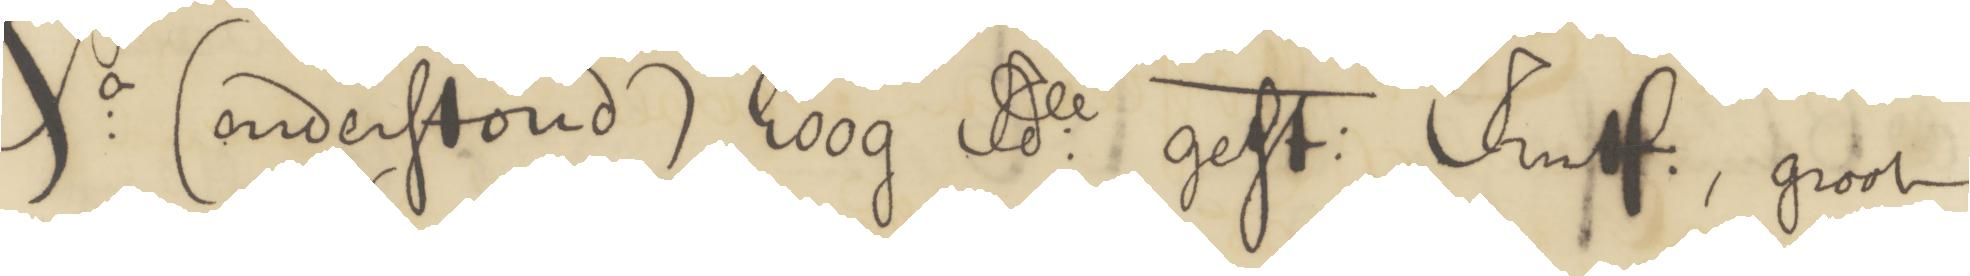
&:a (onderstond) hoog Ed:le gest: Erntf:, groot
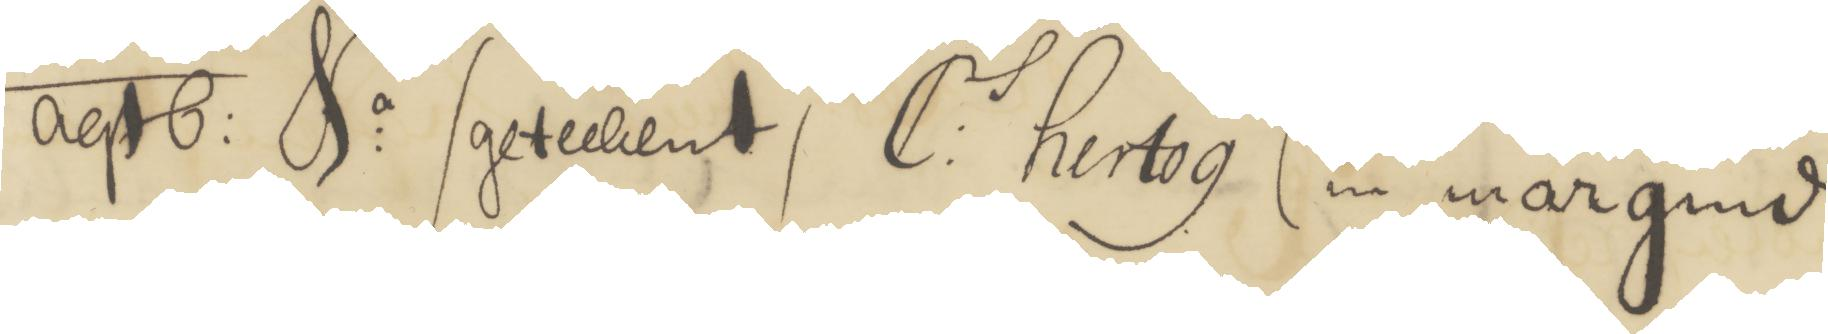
agtb: &:a /geteekent/ C:s hertog (in margine)
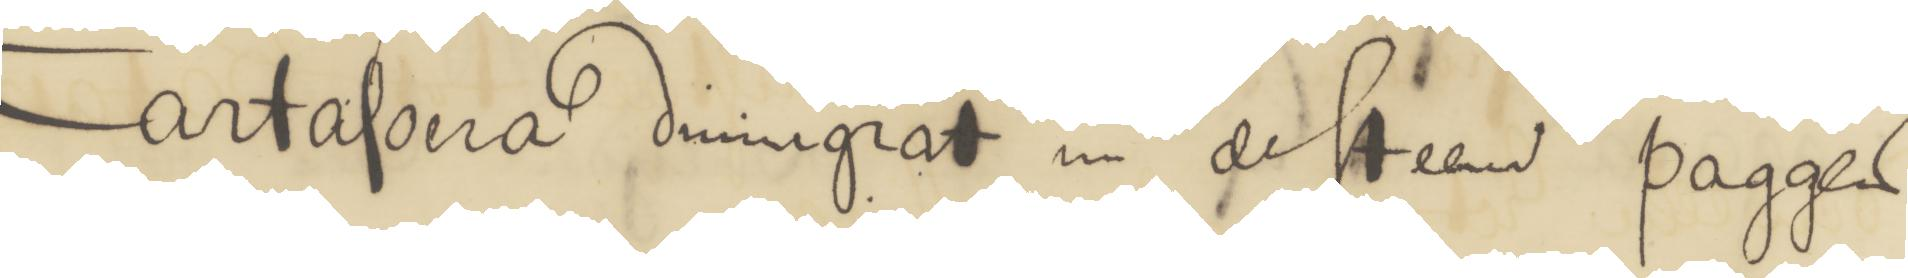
cartasoera diningrat in de steene pagger
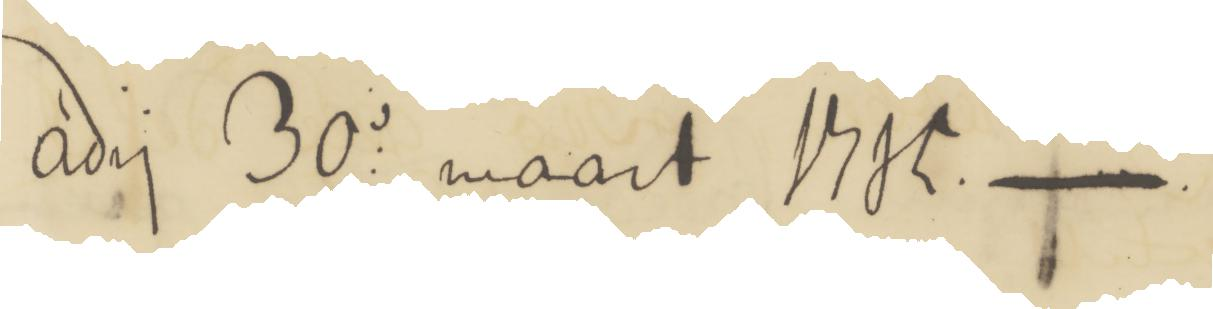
adij 30:' maart 1715. — .
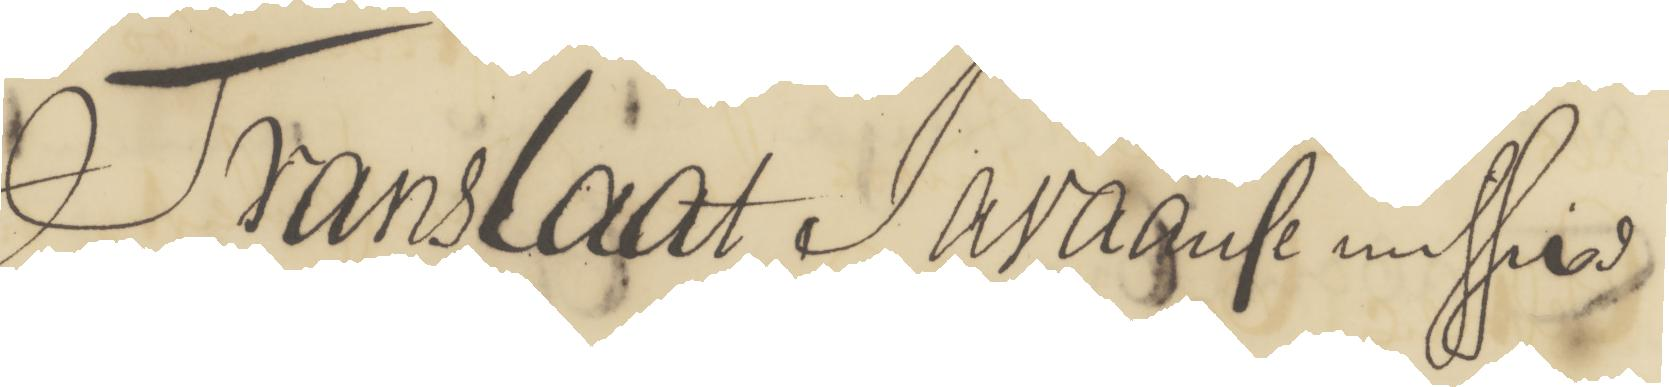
Translaat Javaanse missive
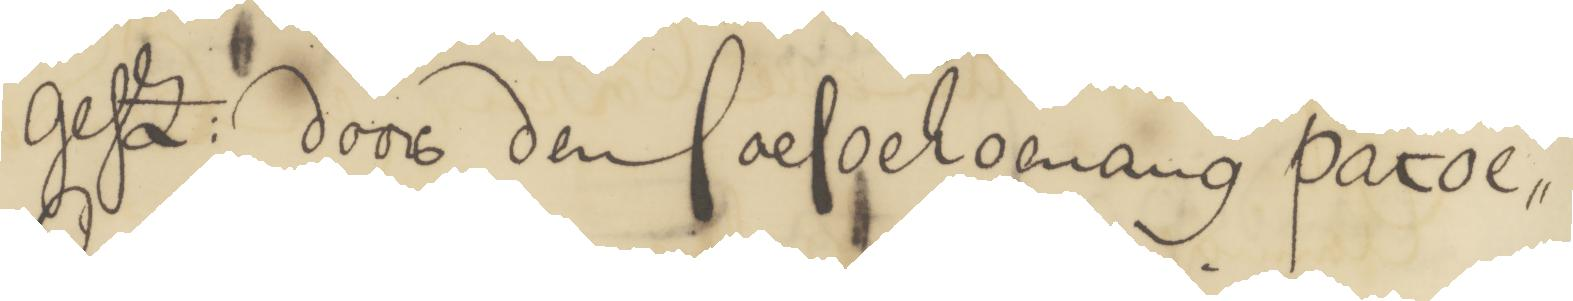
gesz: door den soesoehoenang pacoe„
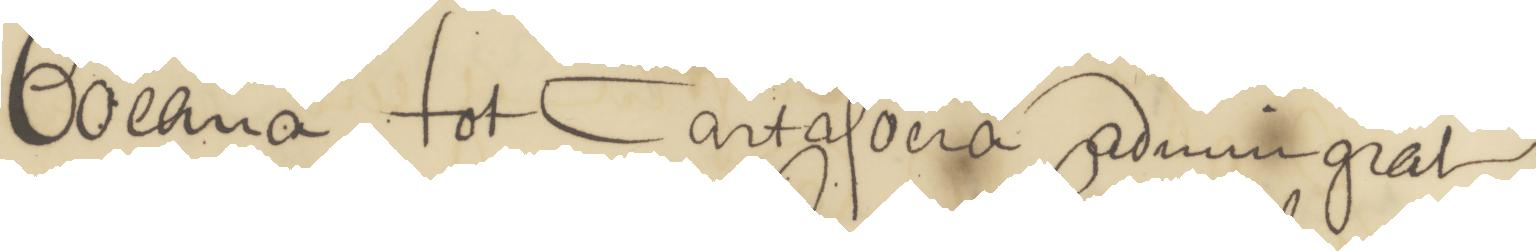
boeana tot Cartasoera adiningrat
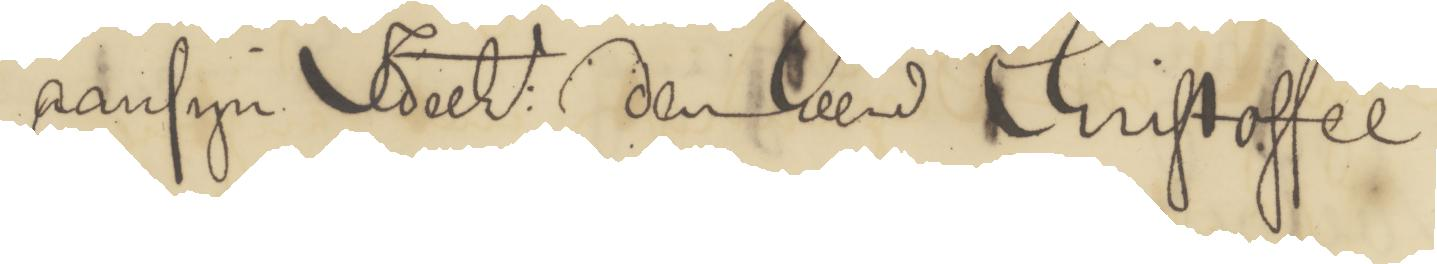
aan sijn Edelh:t den heere Christoffel
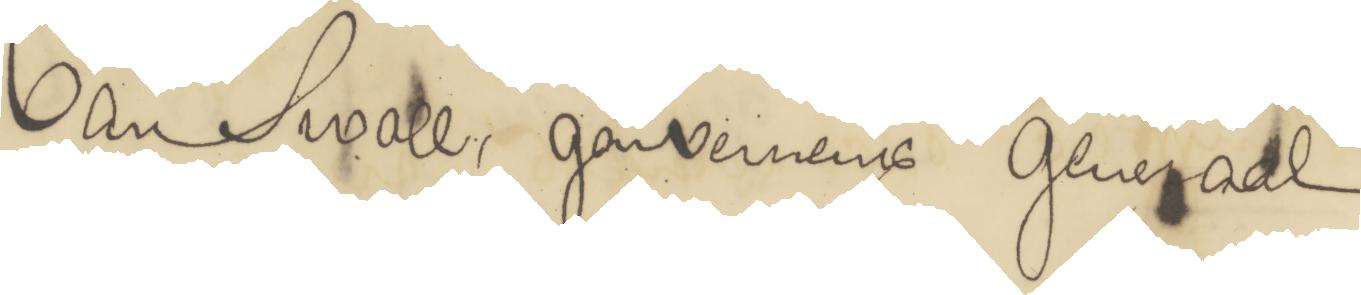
van swoll, gouverneur generaal
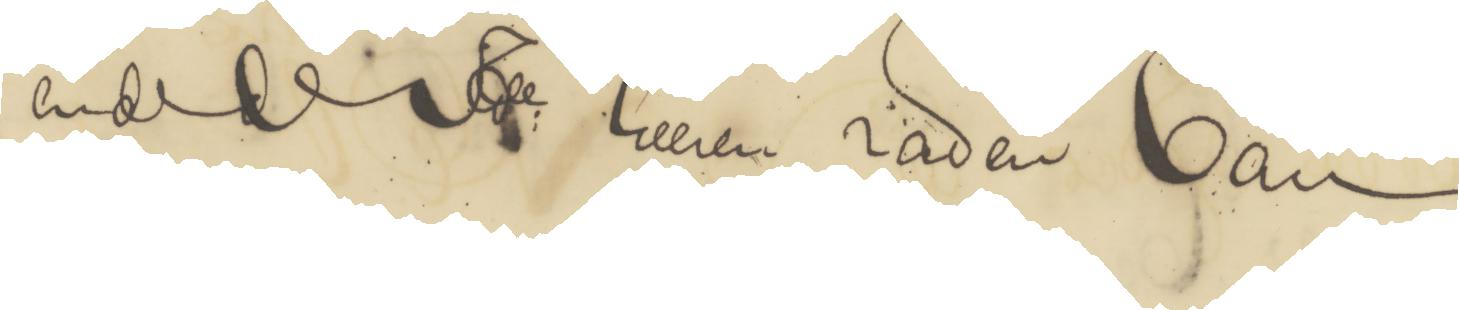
ende de Ed:le heeren raden van
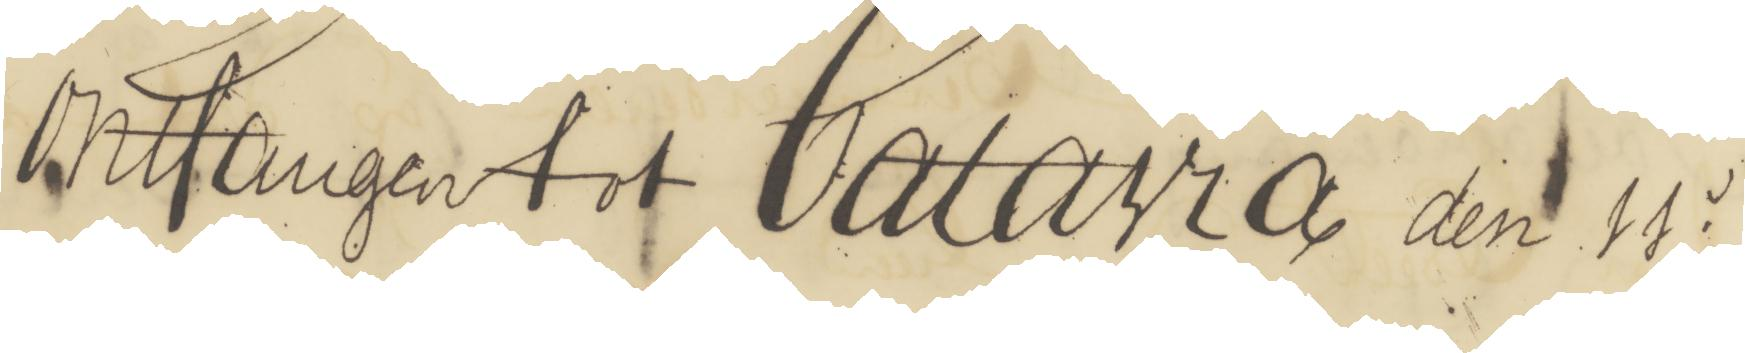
ontfangen tot batavia den 11:'
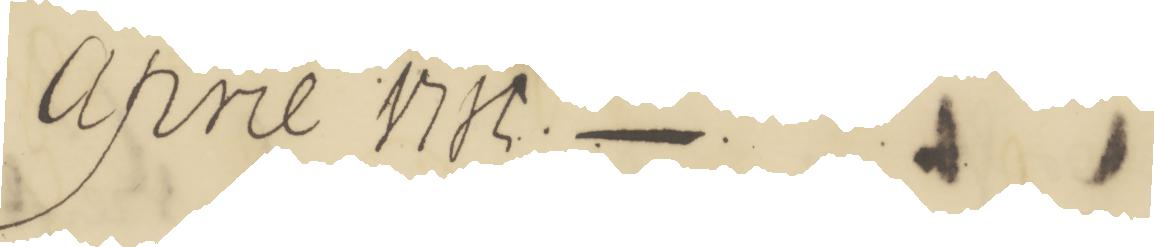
april 1715. — .
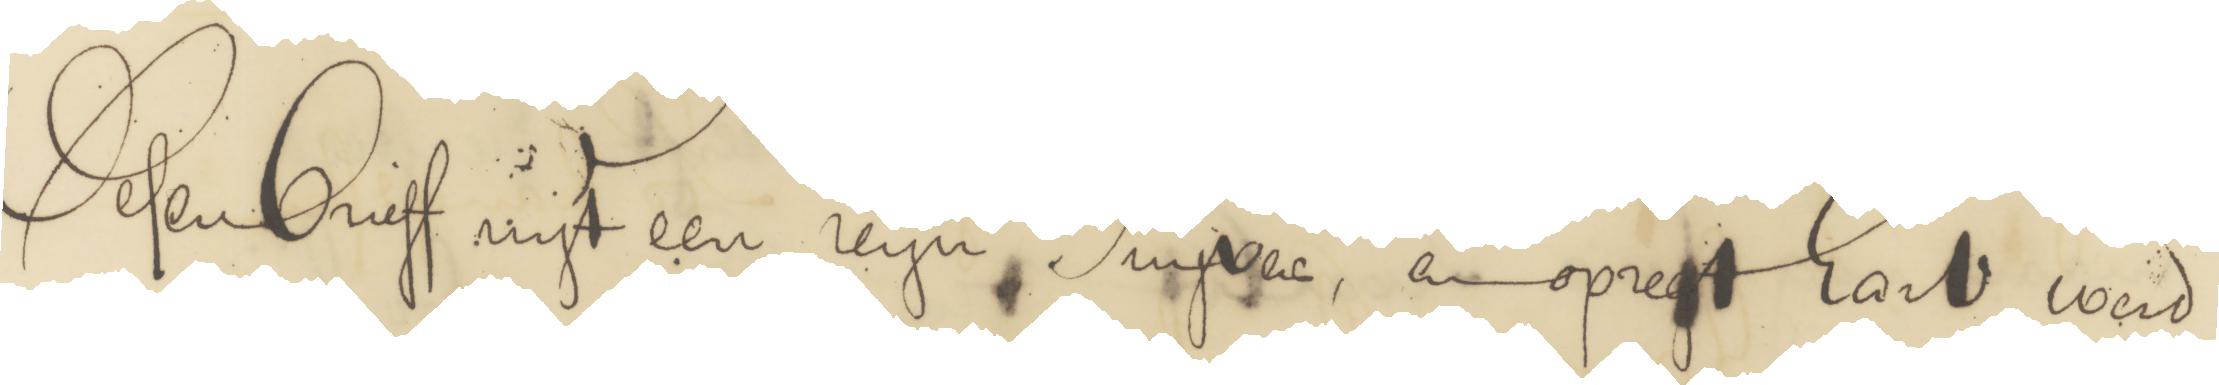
Desen brieff uijt een reijn suijver, en opregt hart werd
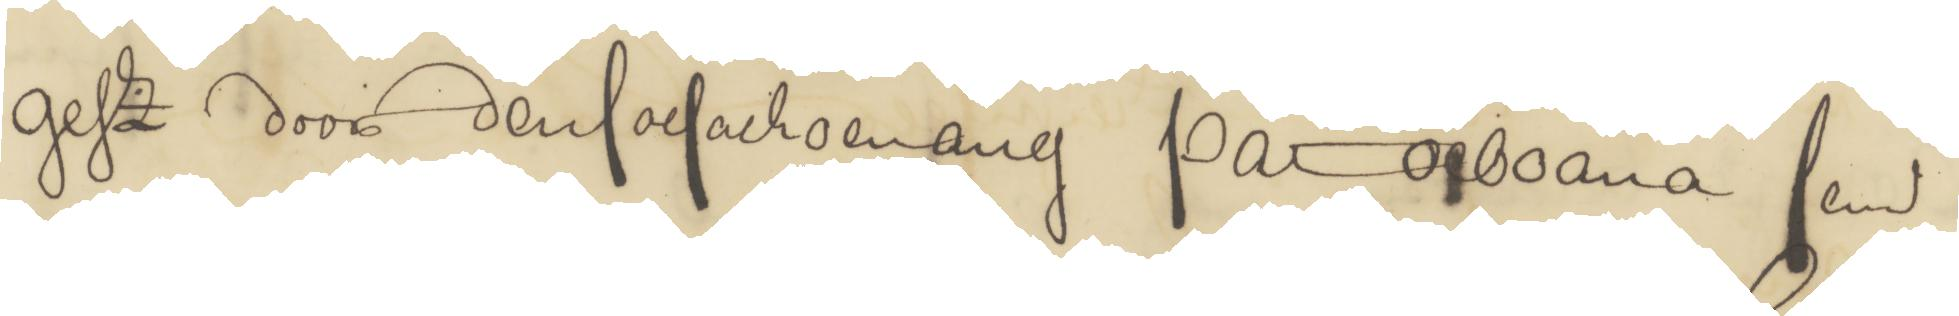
gesz door den soesoehoenang pacoeboana seme
